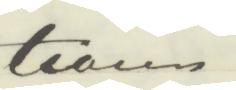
tiaren
